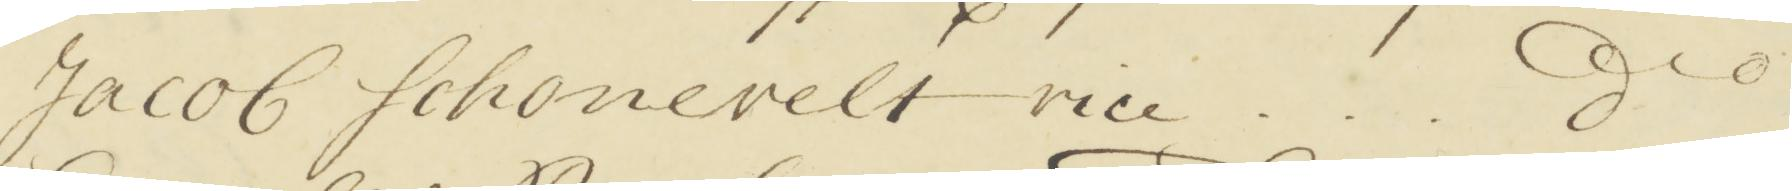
Jacob Schonevelt vice . . . do
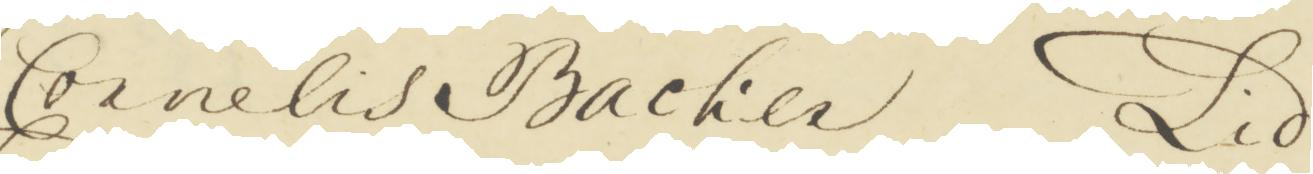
Cornelis Backer Lid
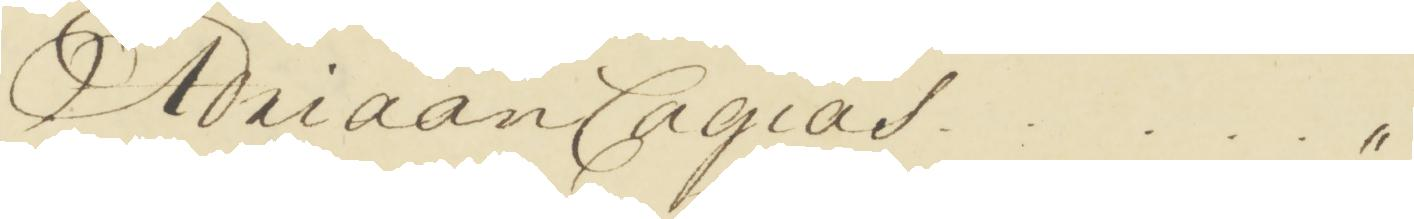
Adriaan Cagias . . . . . „
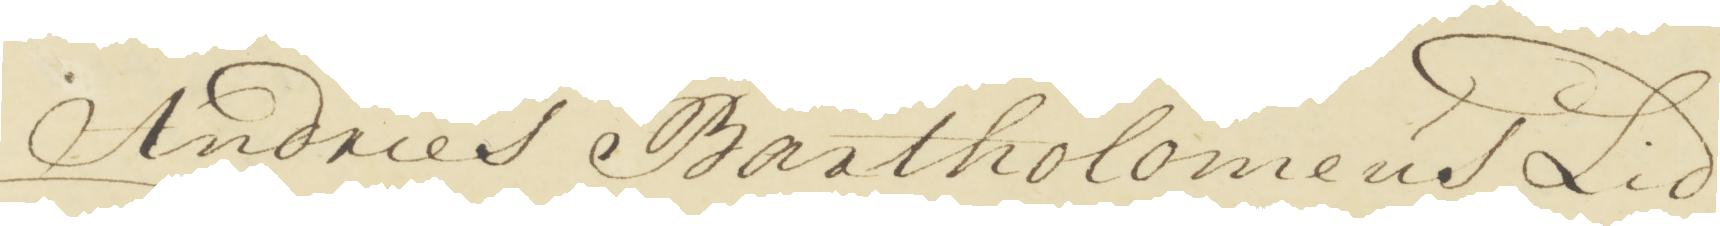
Andries Bartholomeus Lid
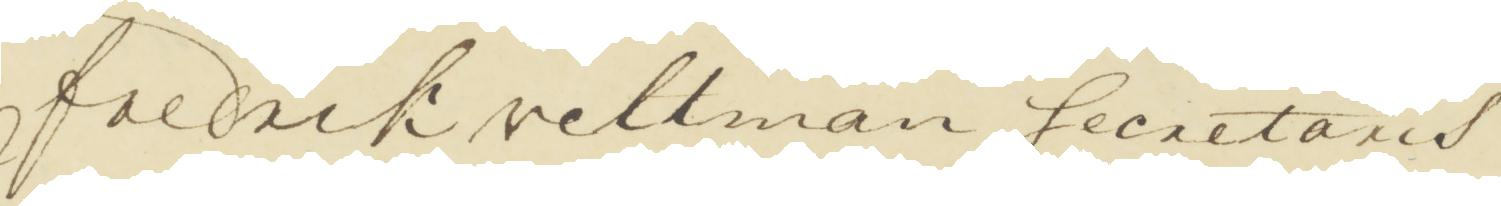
fredrik veltman secretaris
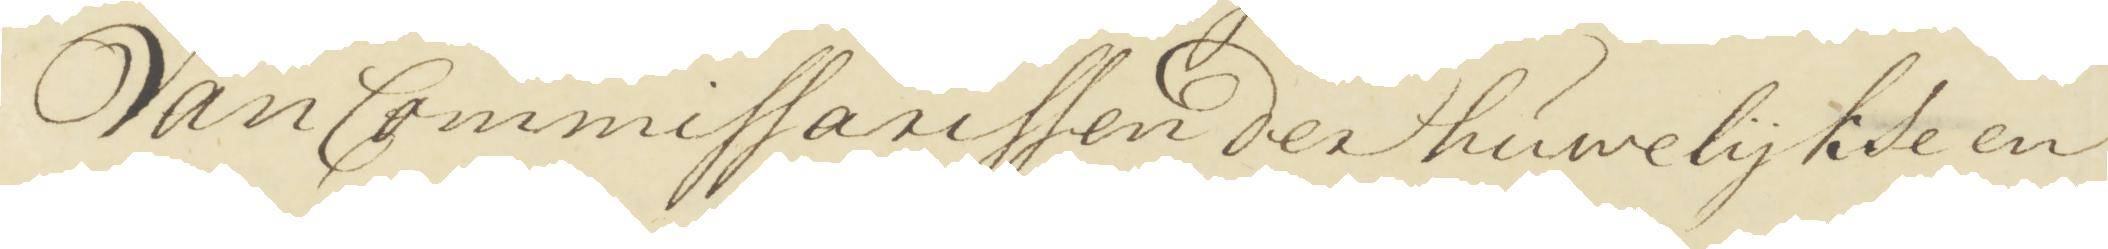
Van Commissarissen der huwelijkse en
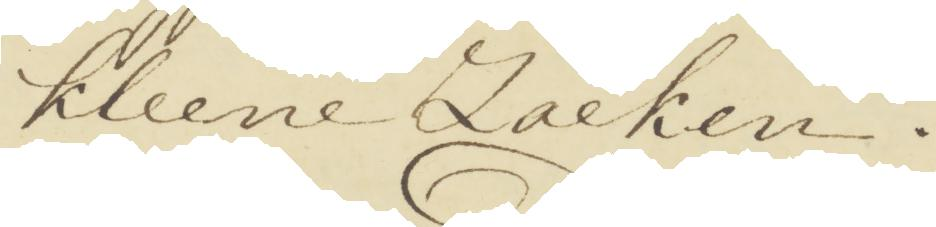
kleene Zaeken.
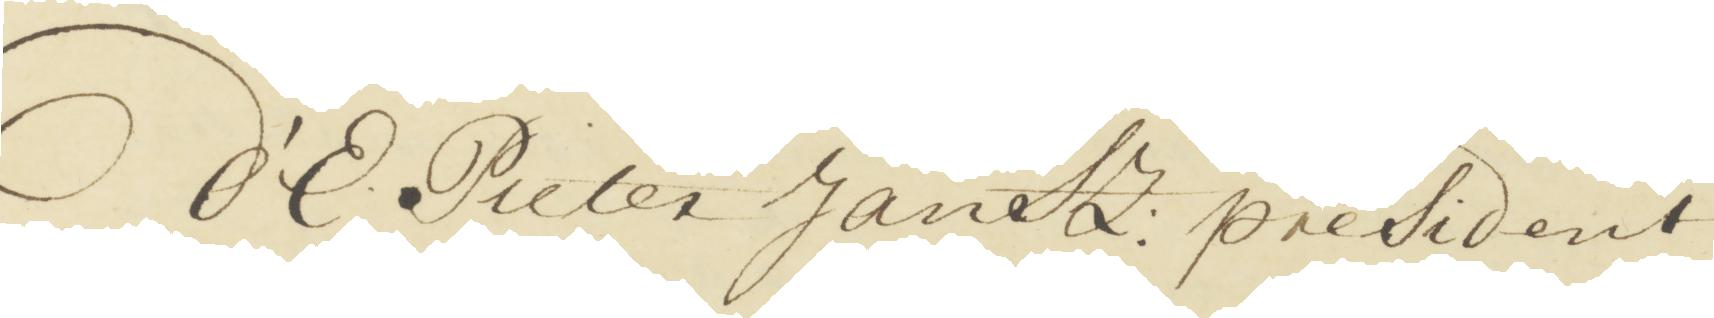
d’E: Pieter Jansz: president
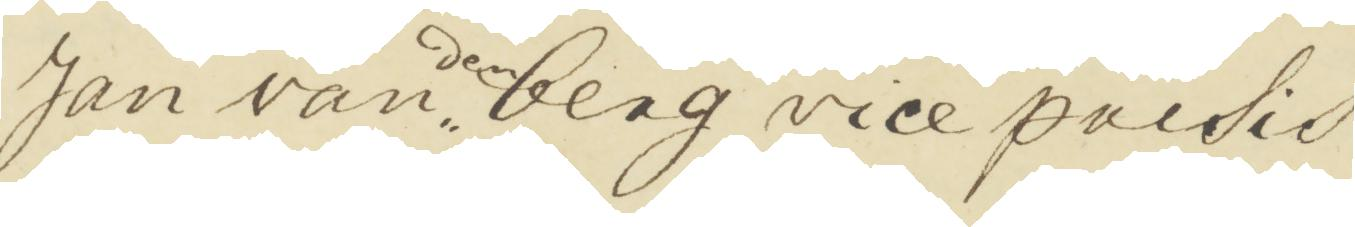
Jan van „ berg vice presis
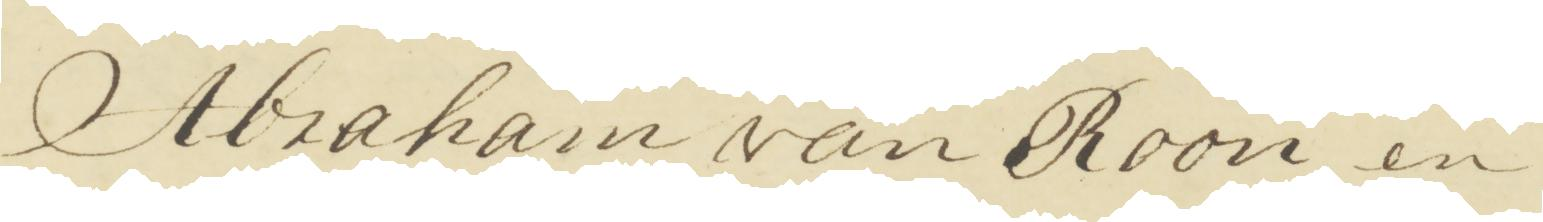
Abraham van Roon en
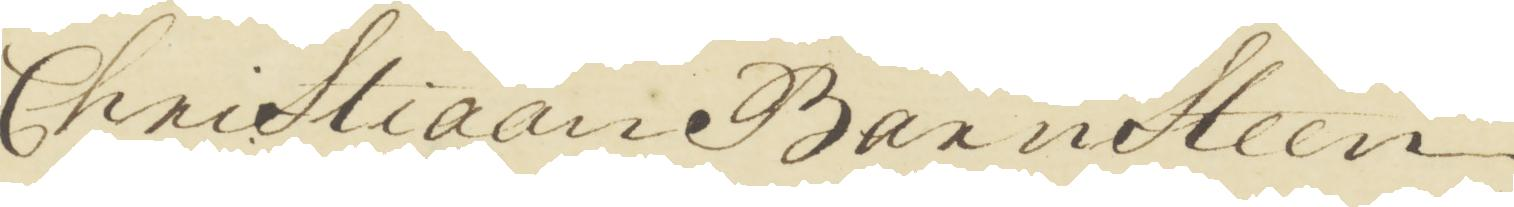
Christiaan Barnsteen
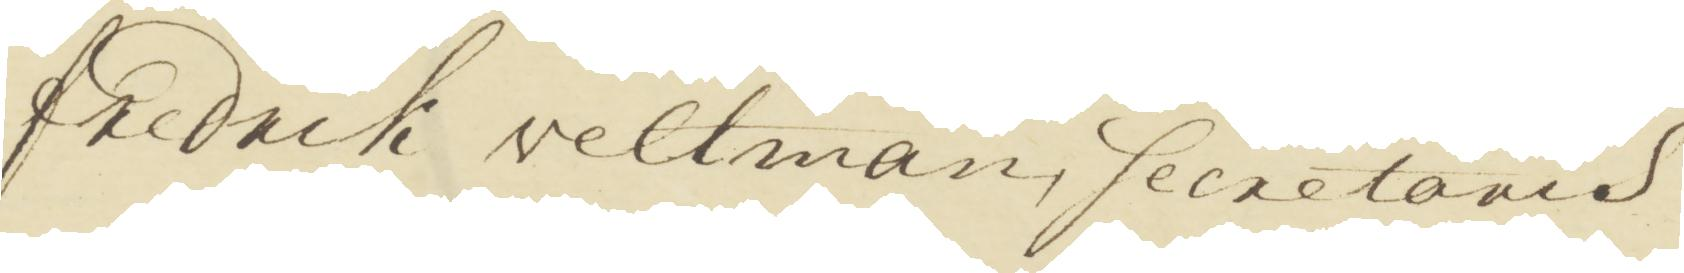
Fredrik vellman, secretaris
